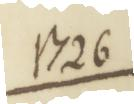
1726
